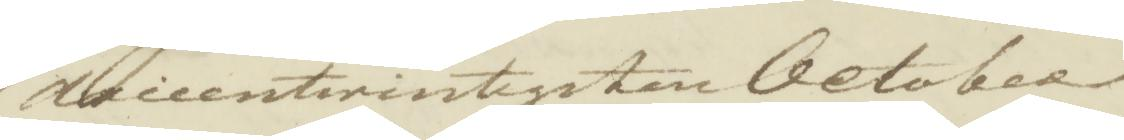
drieentwintigsten October
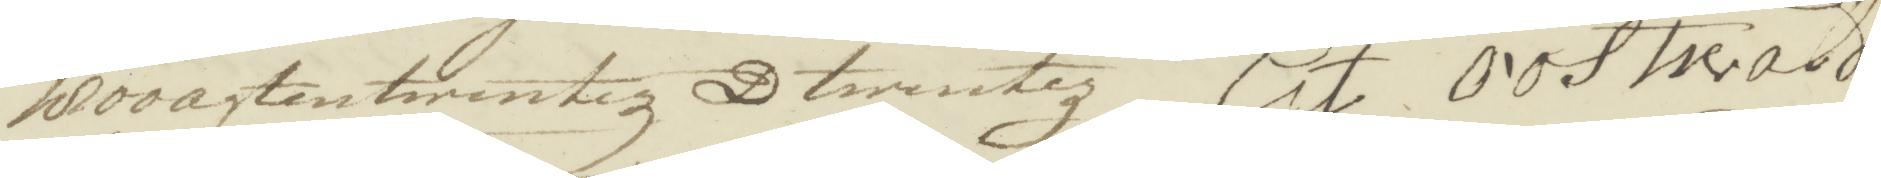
1800agtentwintig D twintig Gt Oostwal
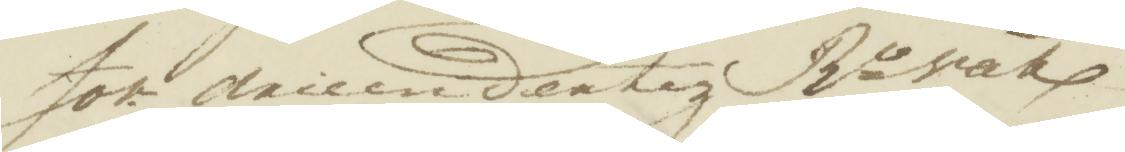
fol. drieen dertig R=o vak
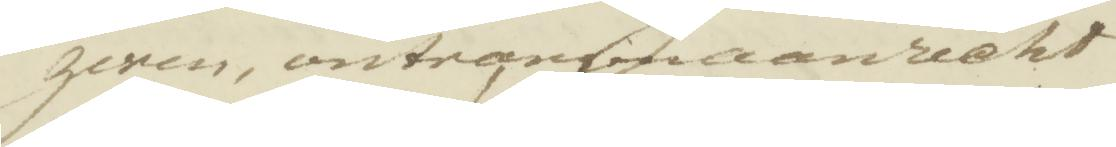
zeven, ontvangen aan recht
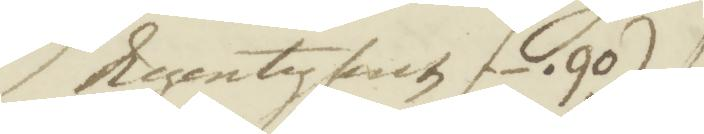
Negentig Cents ƒ-.90
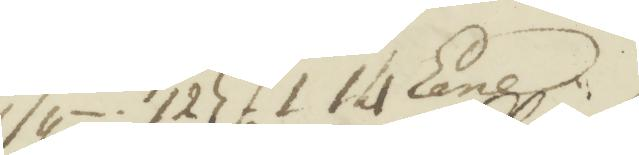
„—. 12 ] ƒ1 14 Eene.
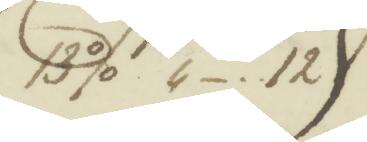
13% „ —. 12
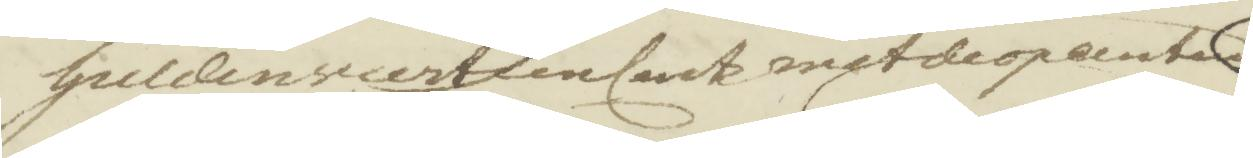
GuldenveertienCent met de opcenten
